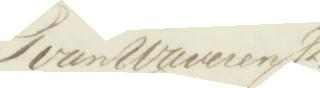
P vanWaveren Jr
